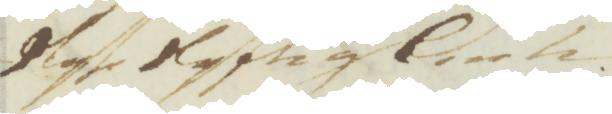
Vijf Vijftig Cents
